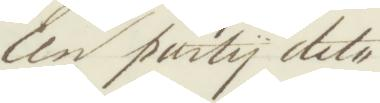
Een partij dito
